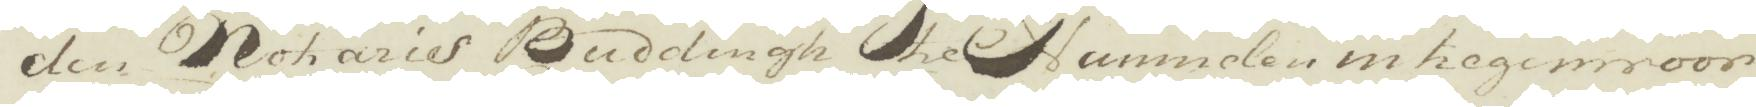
den Notaris Buddingh te Hummelen in tegenwoor
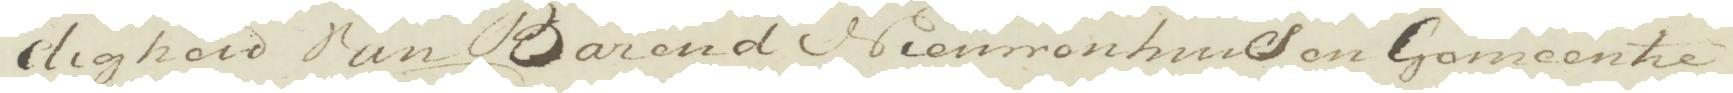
digheid van Barend Nieuwenhuisen Gemeente
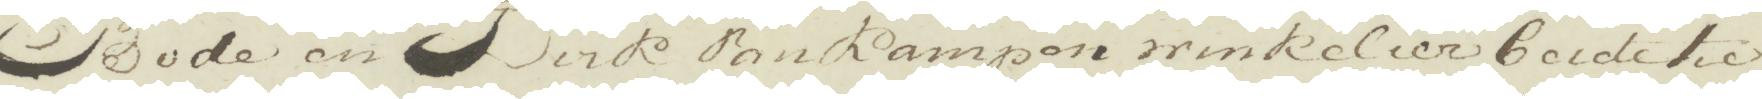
Bode en Dirk van Kampen winkelier beide te
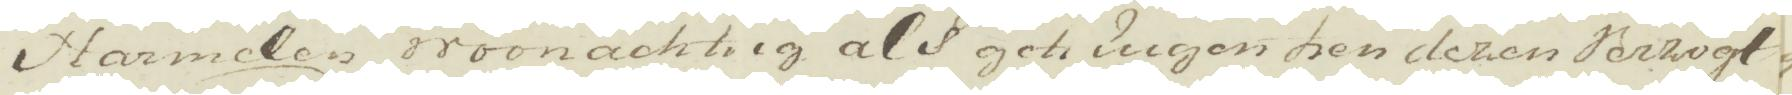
Harmelen woonachtig als getuigen hen dezen Verzogt
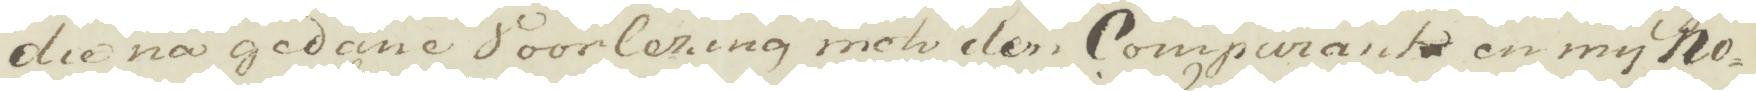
die na gedane Voorlezing met den Comparant en my No„
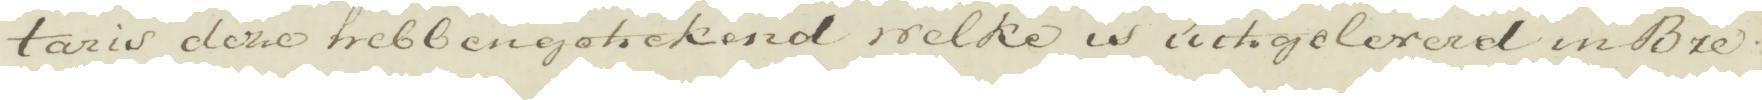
taris deze hebben getekend welke is uitgeleverd in Bre
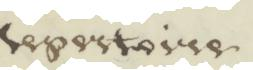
Repertoire
